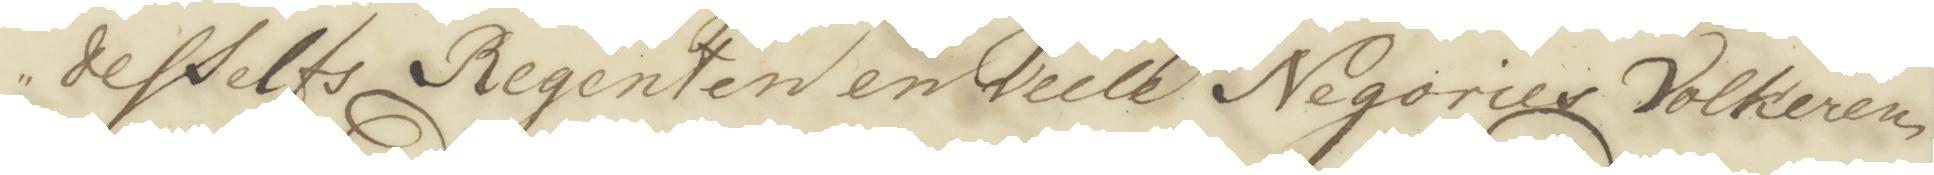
„ desselfs Regenten en veele Negories Volkeren
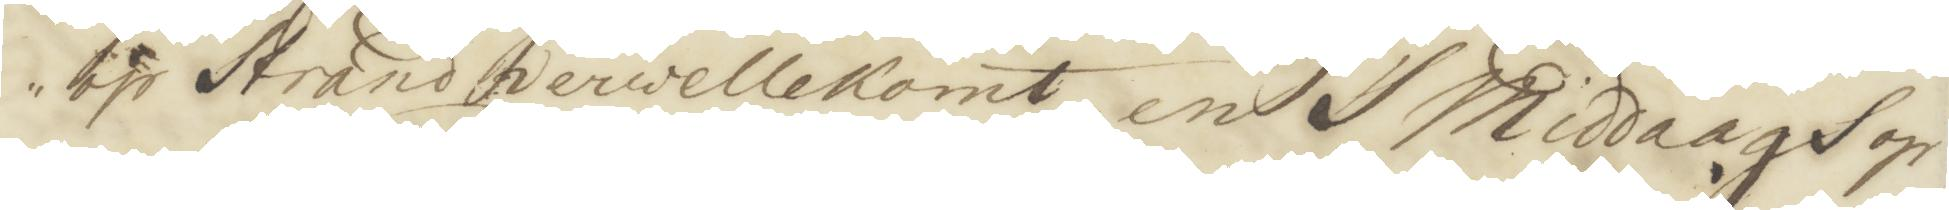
„ op Strand verwellekomt en ’S Middaags op
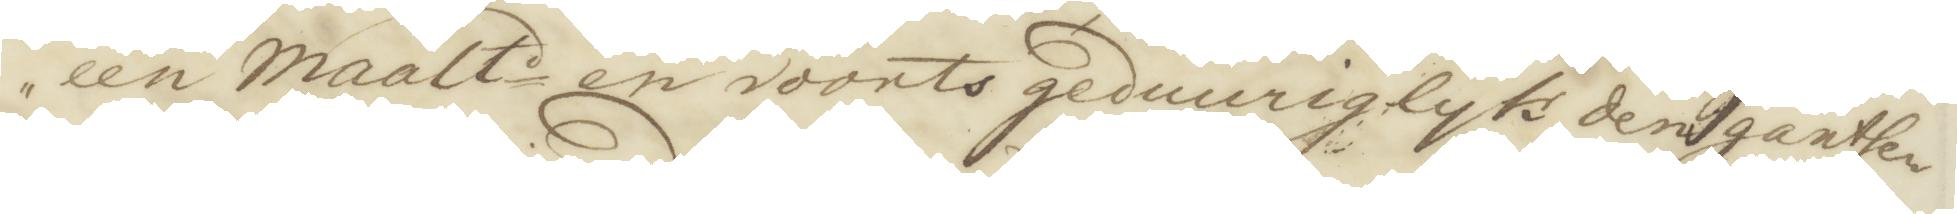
„ een maalt=d en voorts geduuriglyk den gantsen
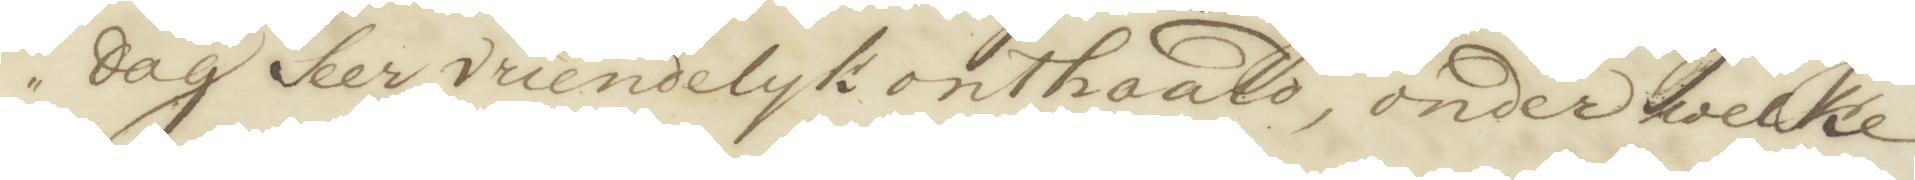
„ dag seer vriendelyk onthaald, onder welke
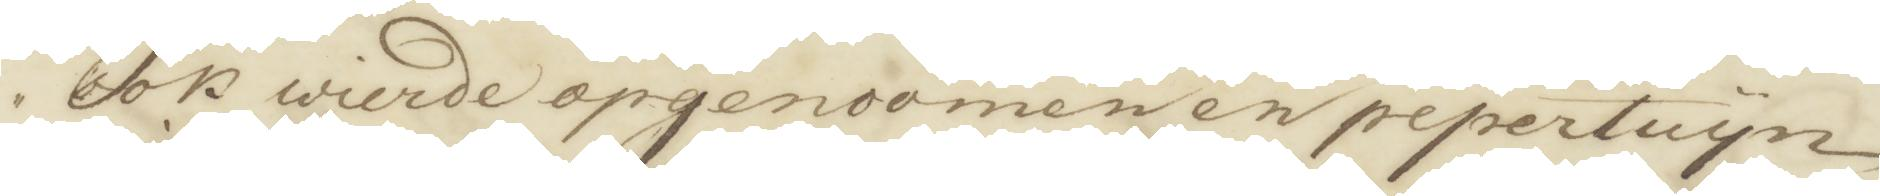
„ ook wierde opgenoomen en pepertuijn
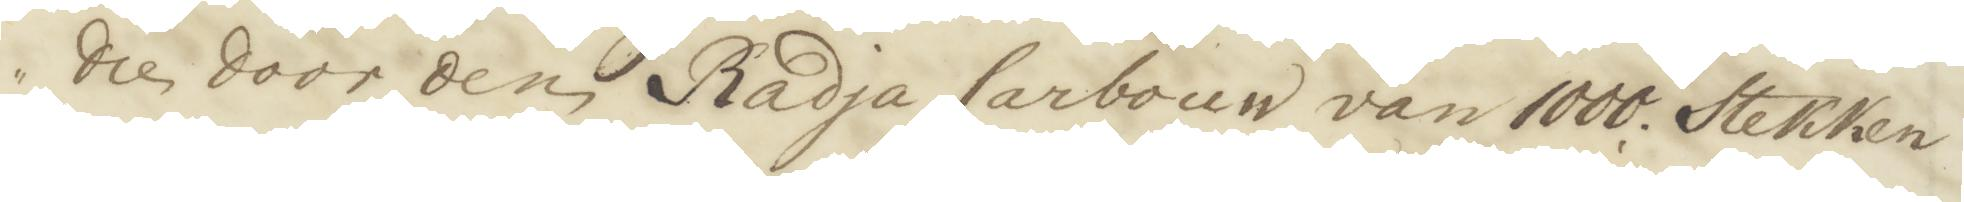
„ die door den Radja Carbouw van 1000. Stekken
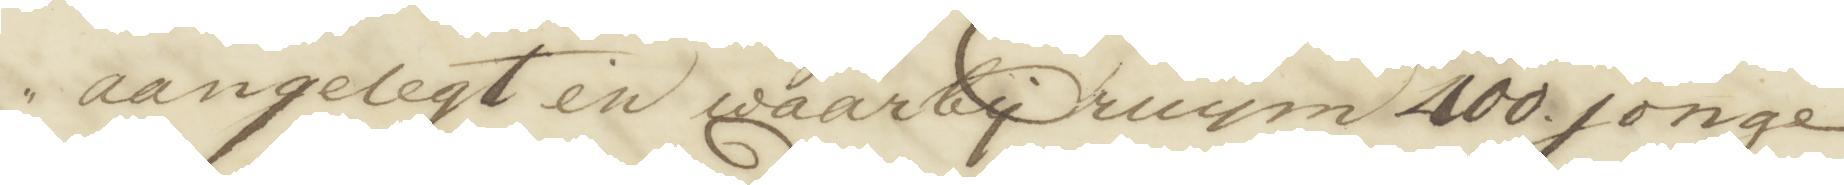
„ aangelegt en waar ruijm 400. jonge
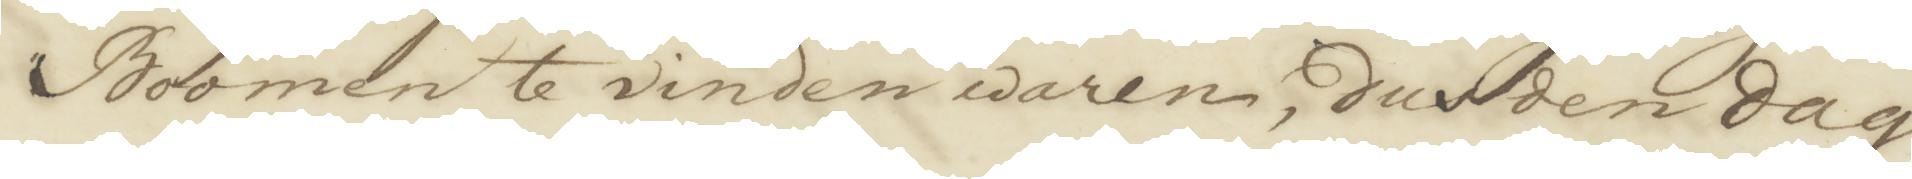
„Boomen te vinden waren, dus den dag
